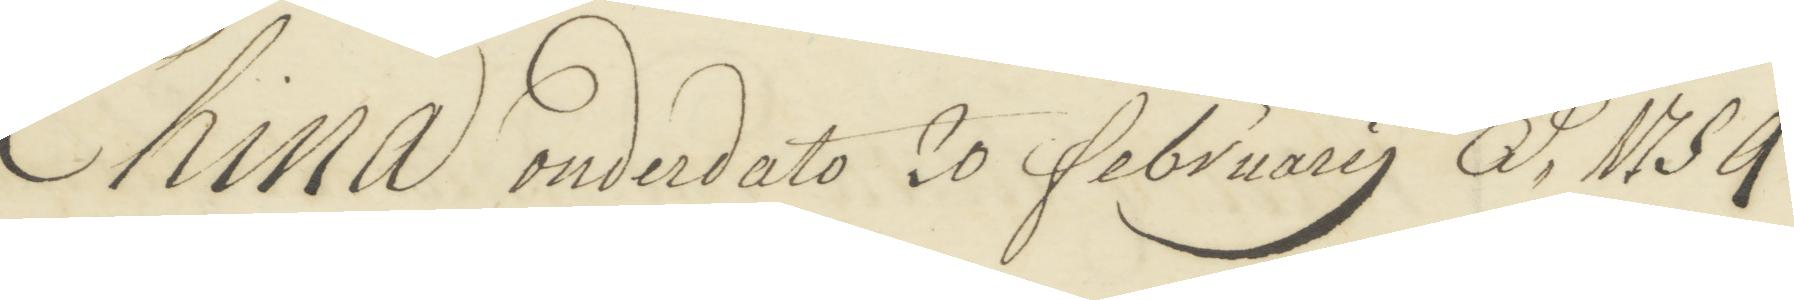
China onderdato 20 februarij A„o 1754
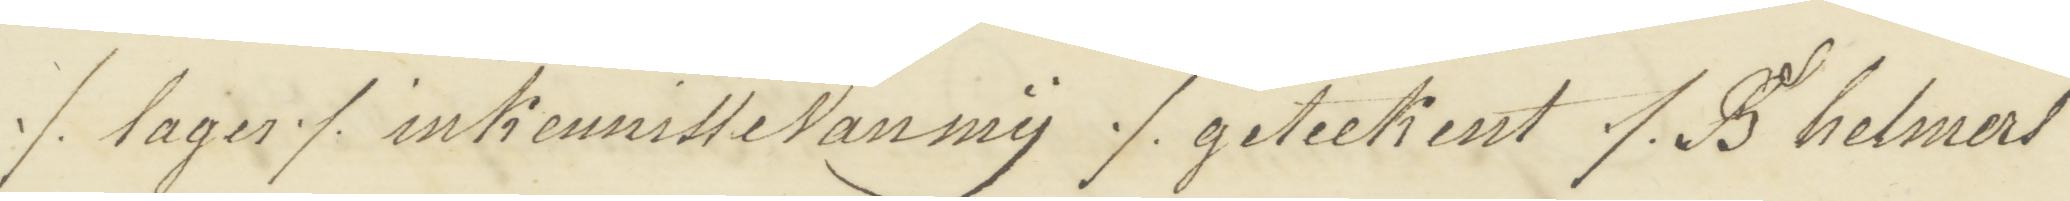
./.lager ./. in kennisse van mij ./. geteekent ./. Bs helmers
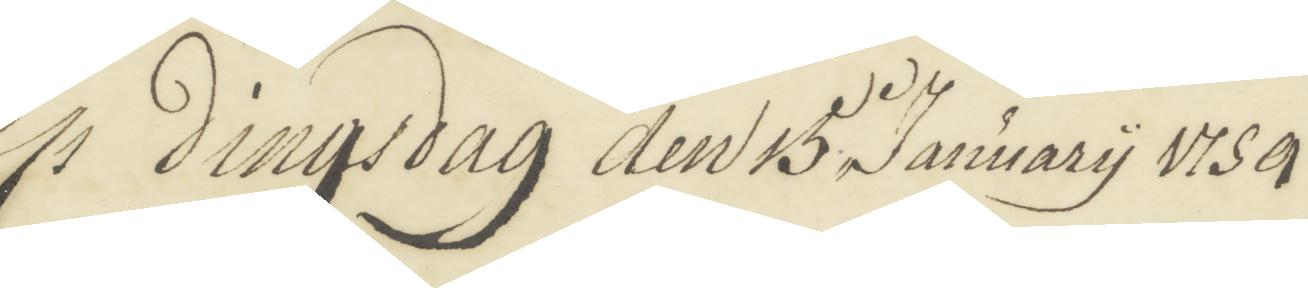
Op dingsdag den 15„' Ianuarij 1754
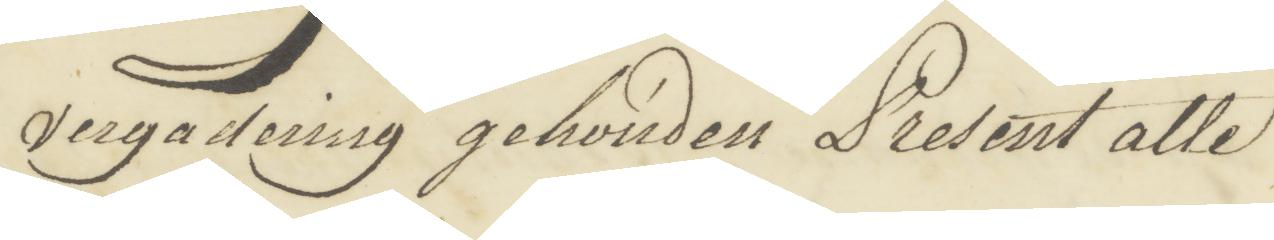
vergadering gehouden Present alle
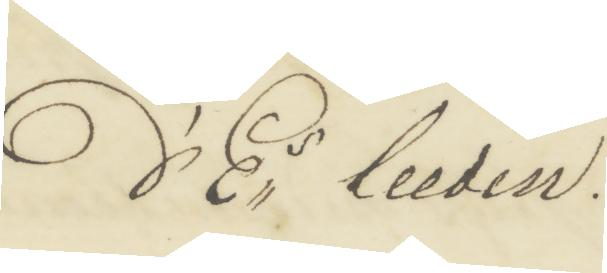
d’ E„s leeden.
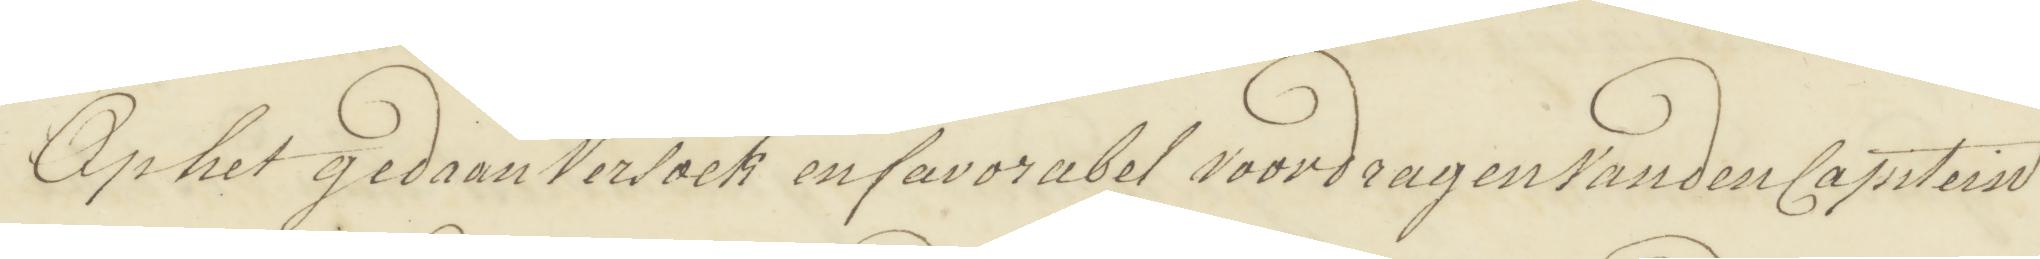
Op het gedaan versoek en favorabel voordragen van den Capitein
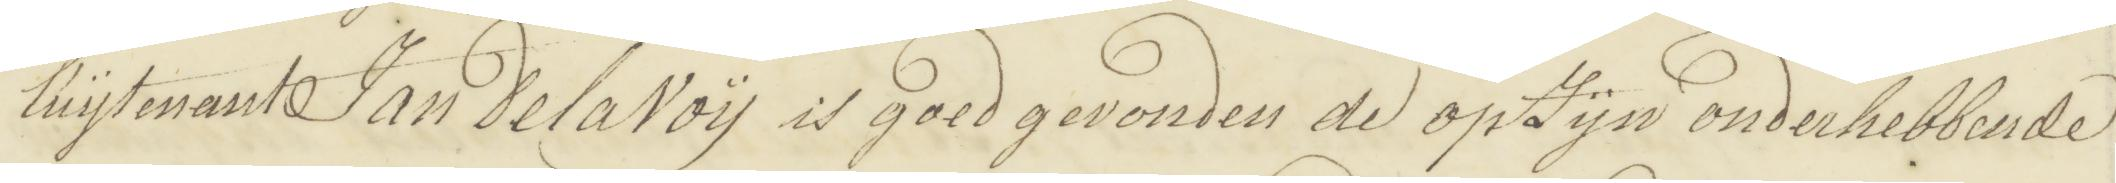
luijtenant Ian delavoij is goed gevonden de op zijn onderhebbende
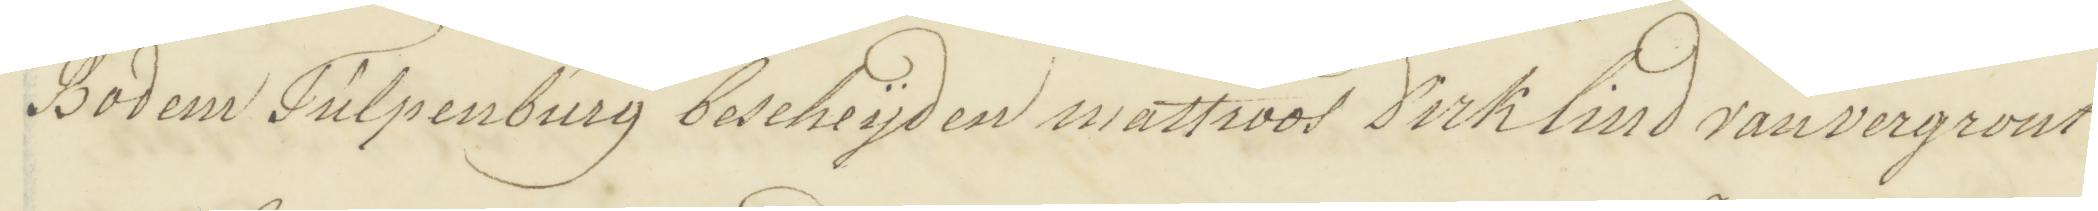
Bodem Tulpenburg bescheijden mattroos Dirk lind van vergront
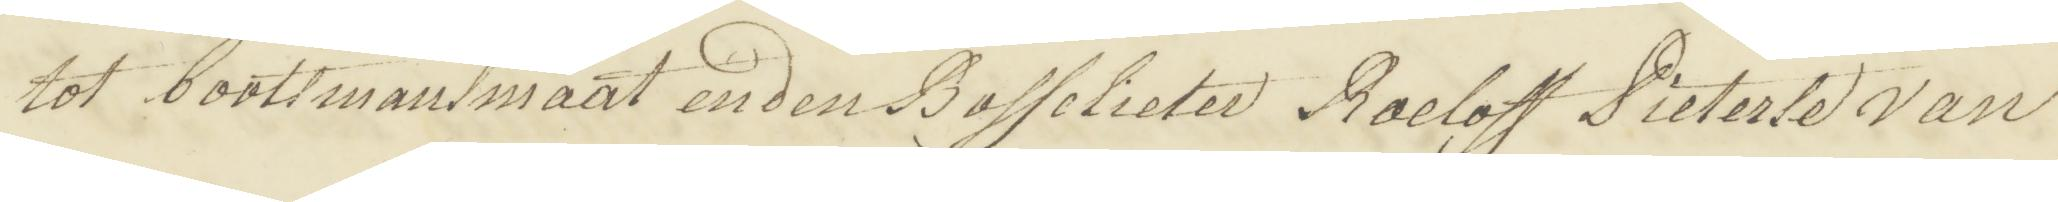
tot bootsmansmaat en den Bosschieter Roeloff Pieterse van
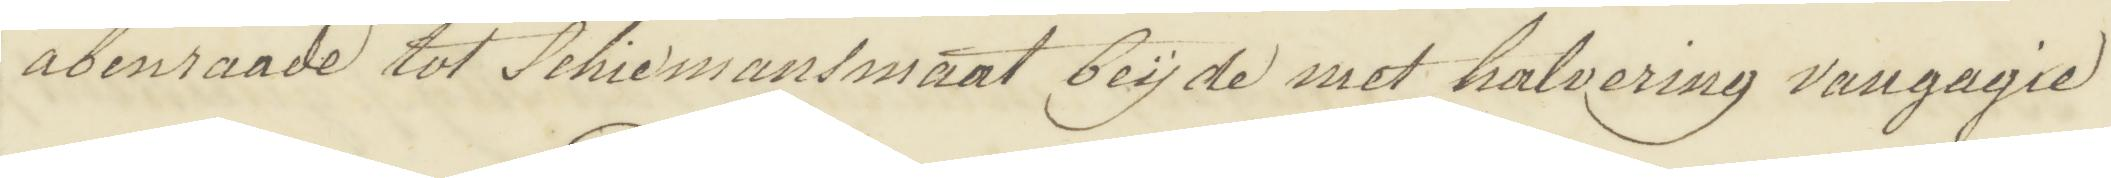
abenraade tot schiemansmaat beij de met halvering van gagie
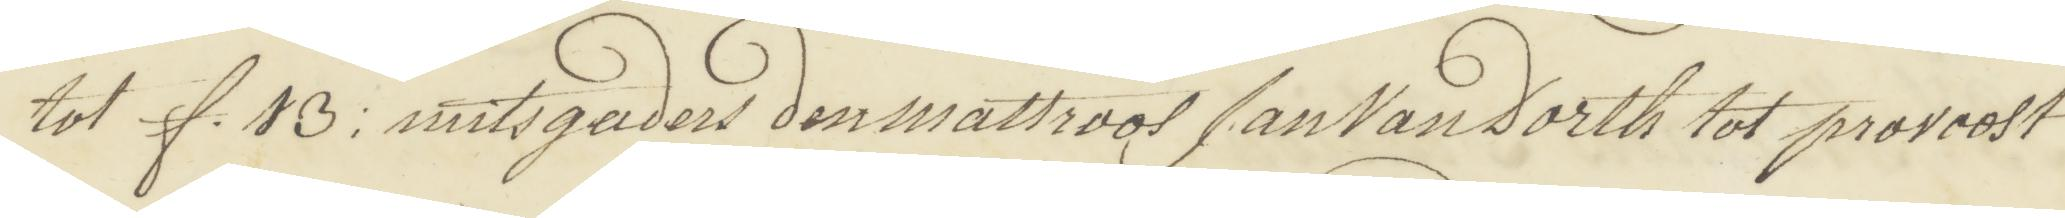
tot ƒ. 13: mitsgaders den mattroos Jan van Dorth tot provoost
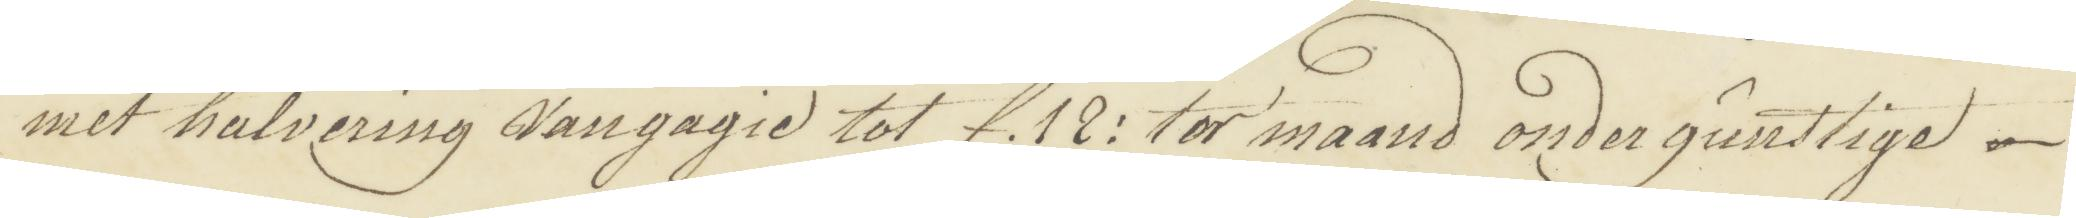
met halvering van gagie tot ƒ.12: ter maand onder gunstige —
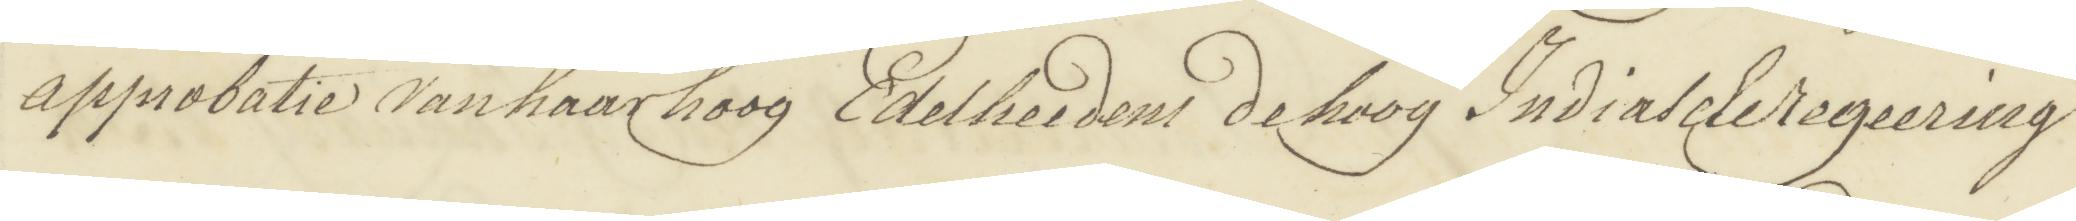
approbatie van haar hoog Edelheedens de hoog Indiascheregeering
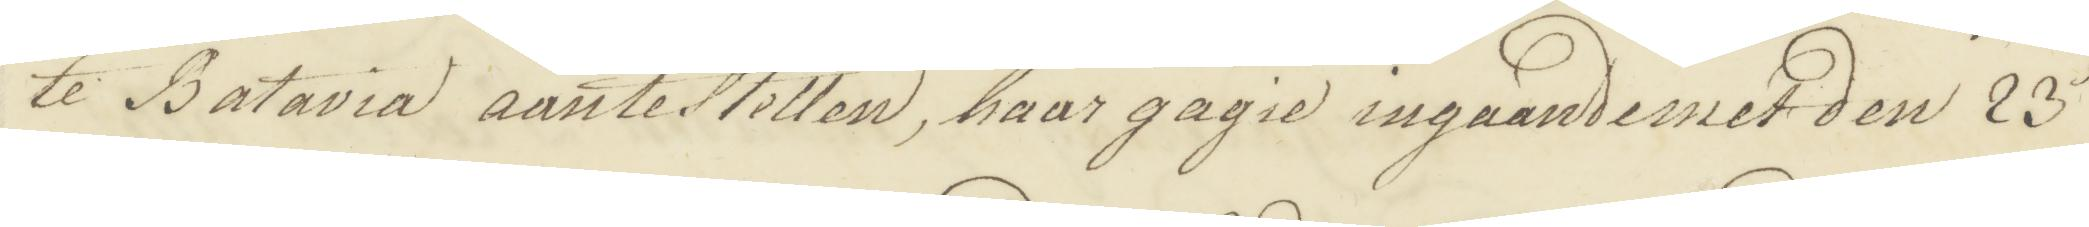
te Batavia aante stellen, haar gagie ingaande met den 23e
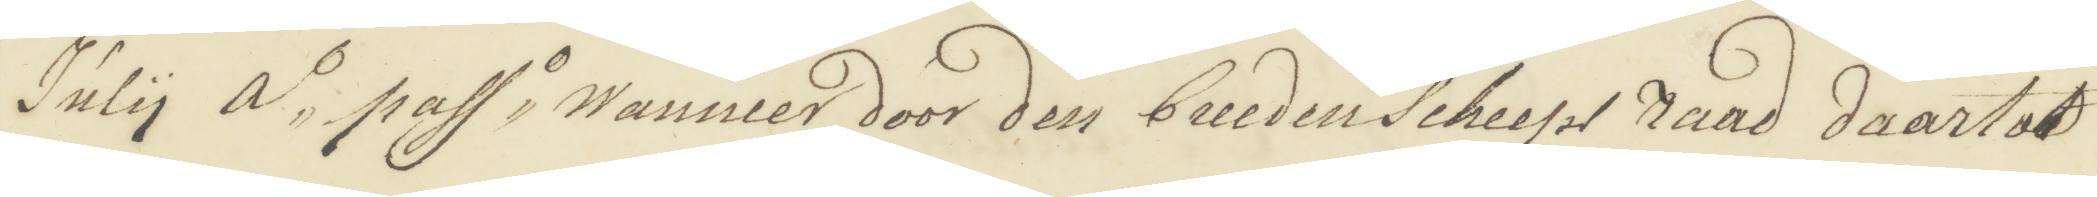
Iulij a„o pass„o wanneer door den breeden scheeps raad daar tot
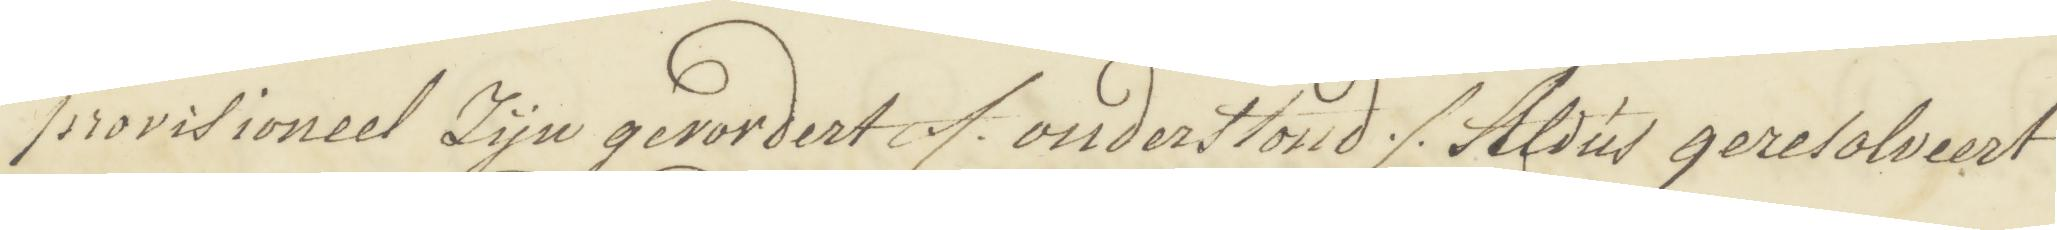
provisioneel zijn gevordert ./. onderstond ./. Aldus geresolveert
